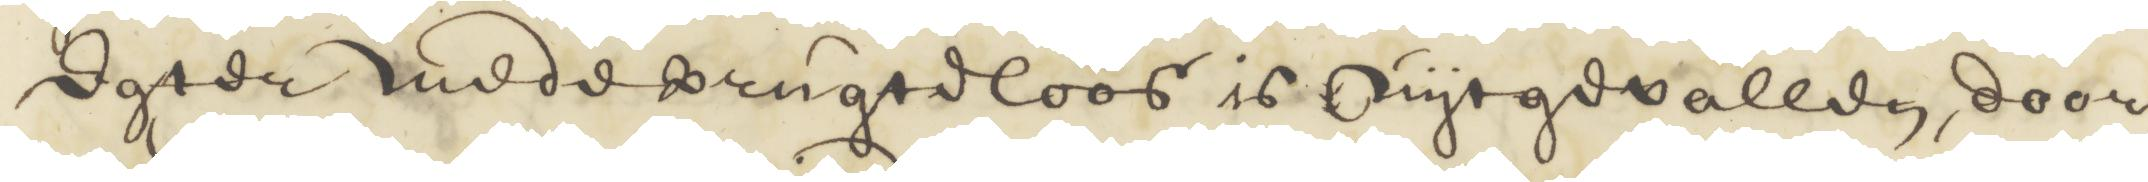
Egter Mede vrugteloos is Uijtgevallen, door
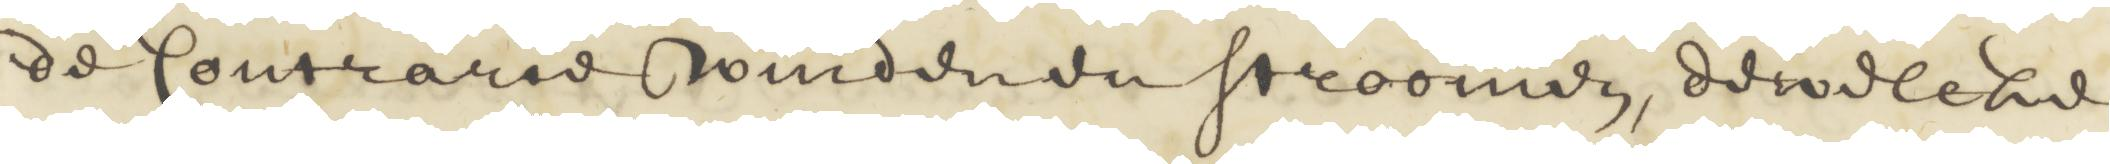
de Contrarie Winden en stroomen, de welcke
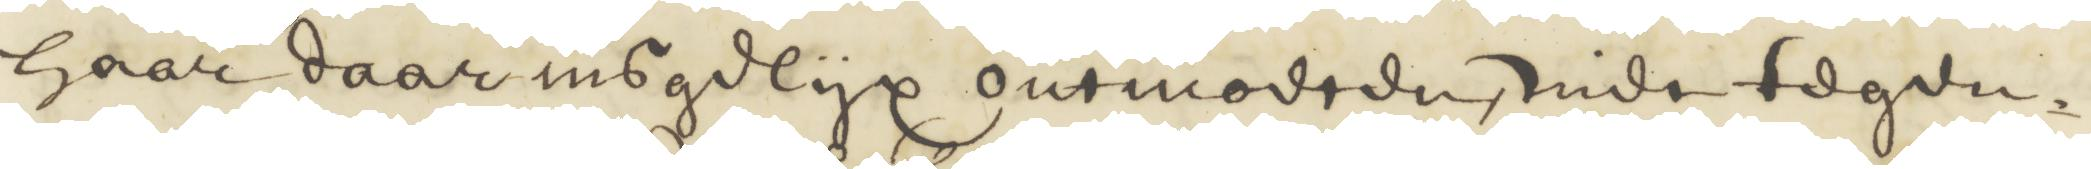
haar daar insgelijx ontmoeten, Niet tegen„
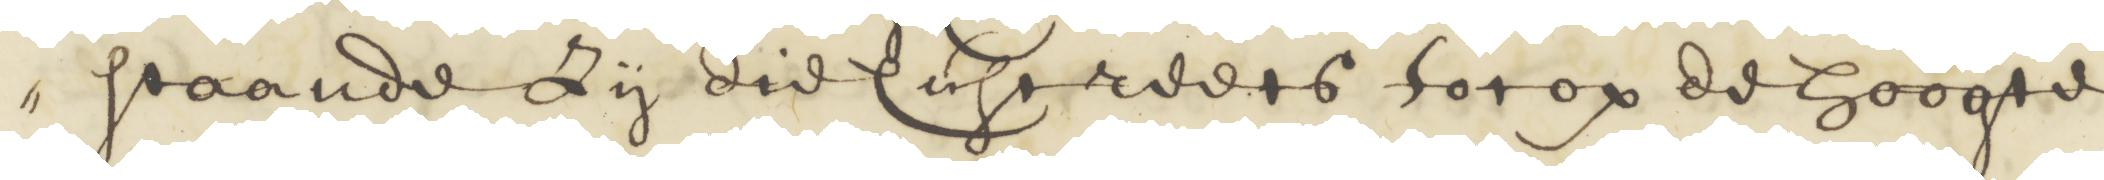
„staande zij die Cust reets tot op de hoogte
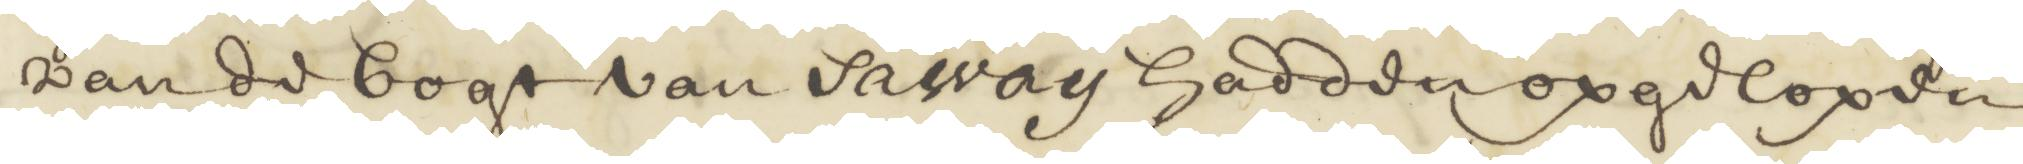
van de bogt van sawaij hadden opgelopen
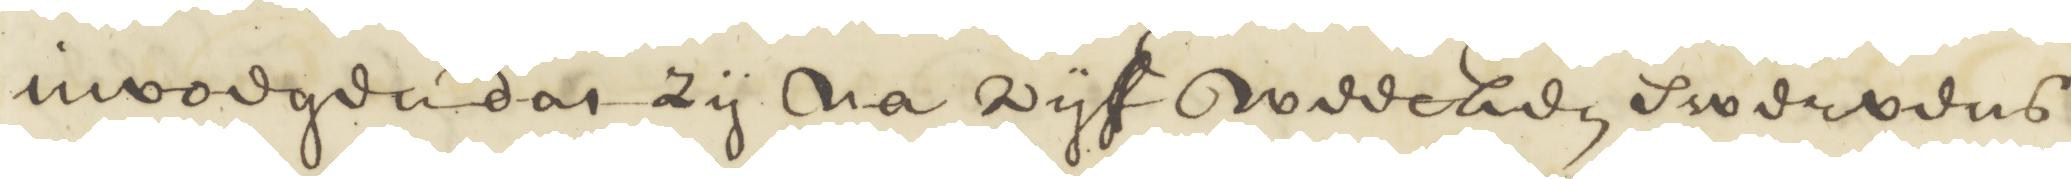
invoegen dat zij Na vijff Weecken swervens
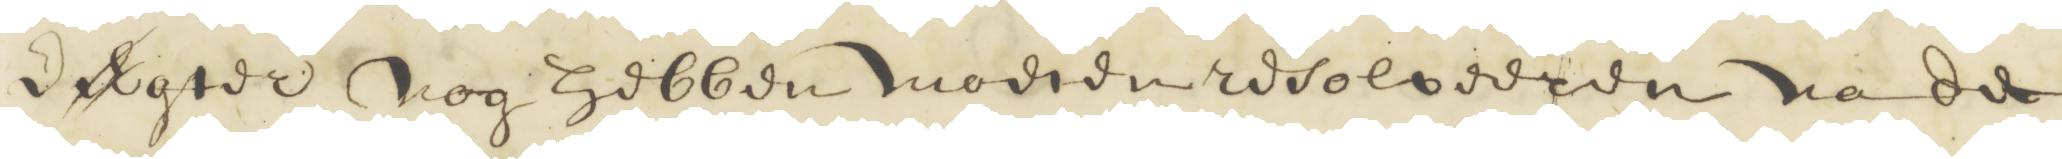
EEgter Nog hebben Moeten resolveeren Na de
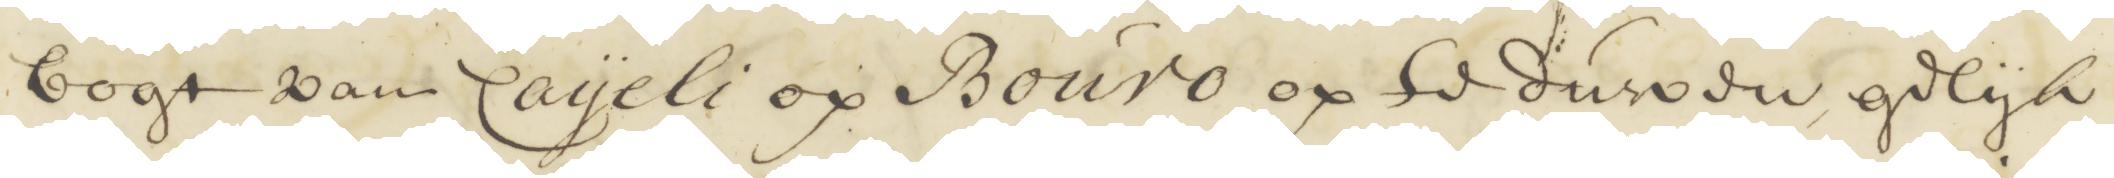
bogt van Caijeli op Bouro op te duwen, gelijk
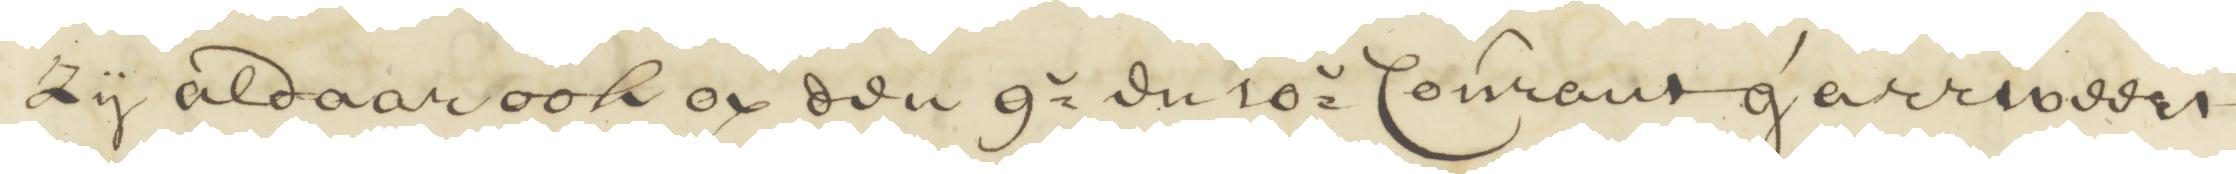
zij aldaar ook op den 9=e en 10=e Courant g’arriveert
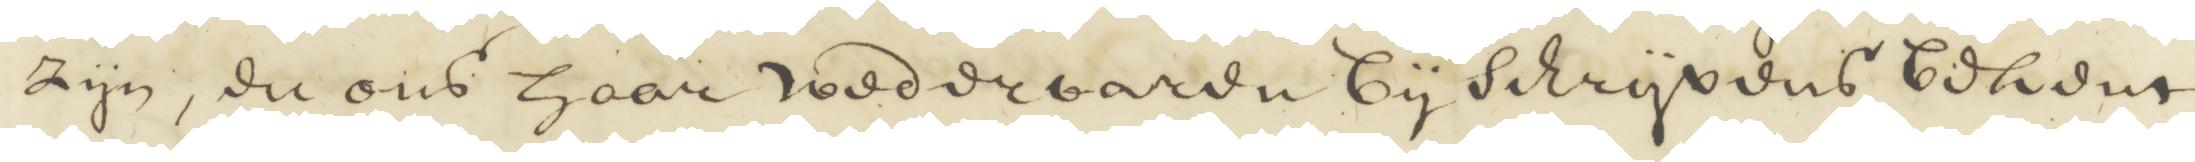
zijn, en ons haar wedervaren bij schrijvens bekent
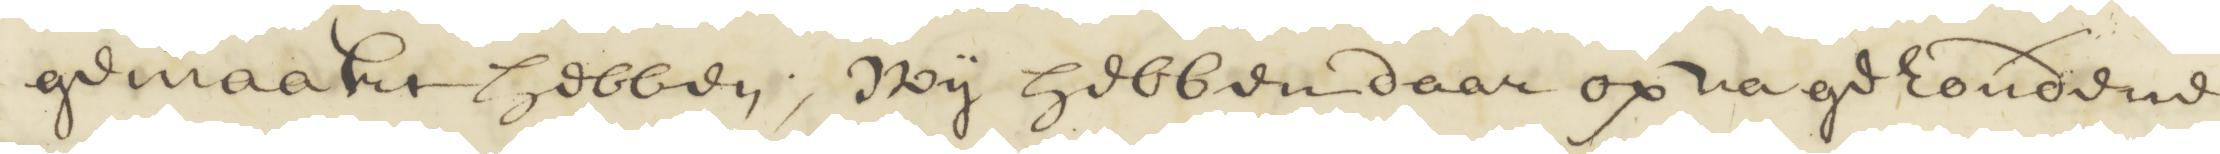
gemaakt hebben, Wij hebben daar op na gehoudene
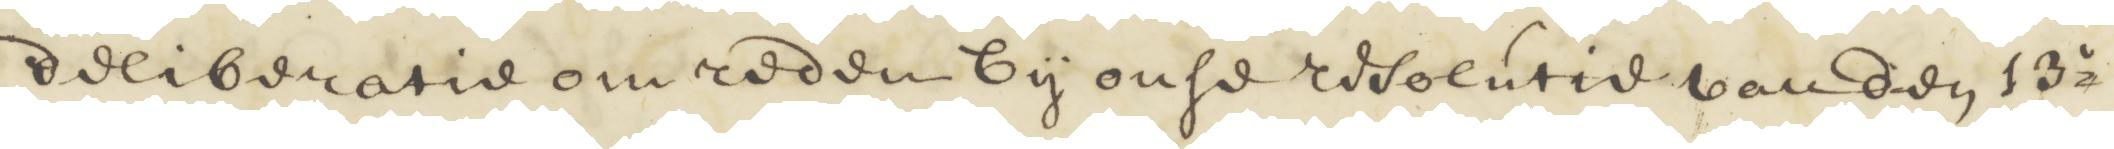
deliberatie om reden bij onse resolutie van den 13=e
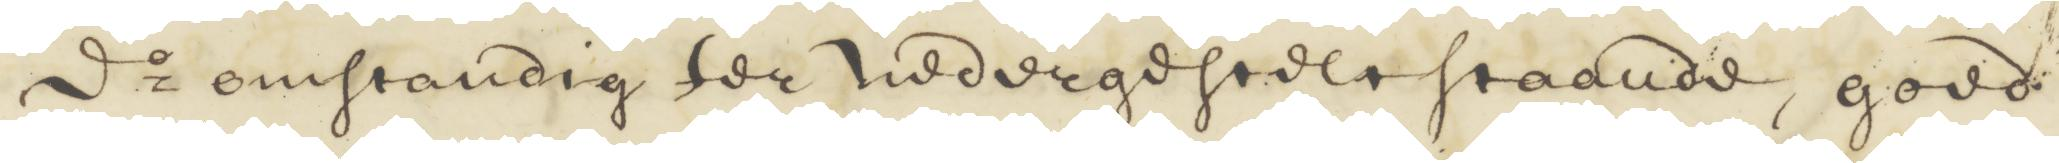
d=o omstandig ter Nedergestelt staande, goed
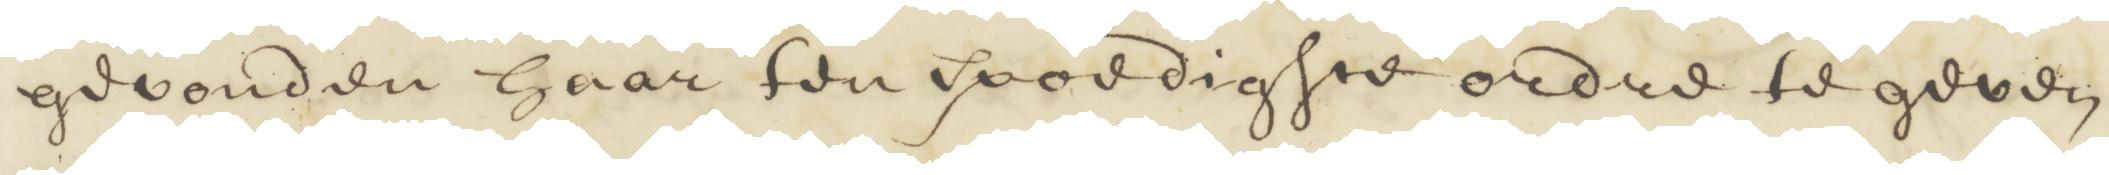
gevonden haar ten spoedigste ordre te geven
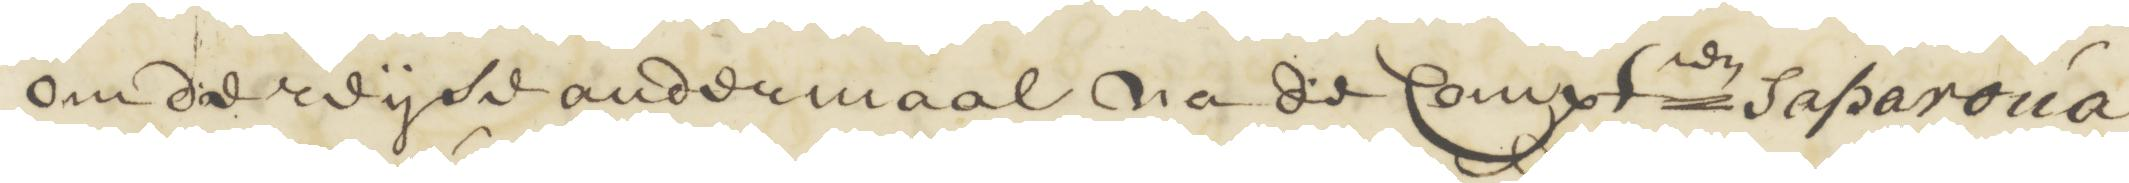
om de reijse andermaal na de Compt=en saparoua
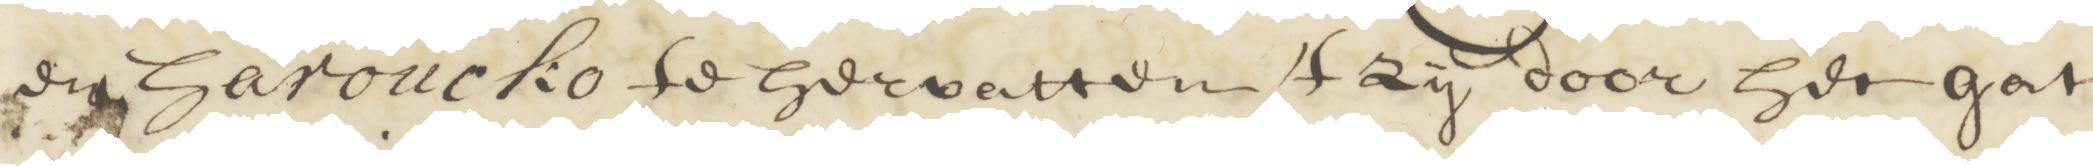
en Haroucko te hervatten 't zij door het gat
